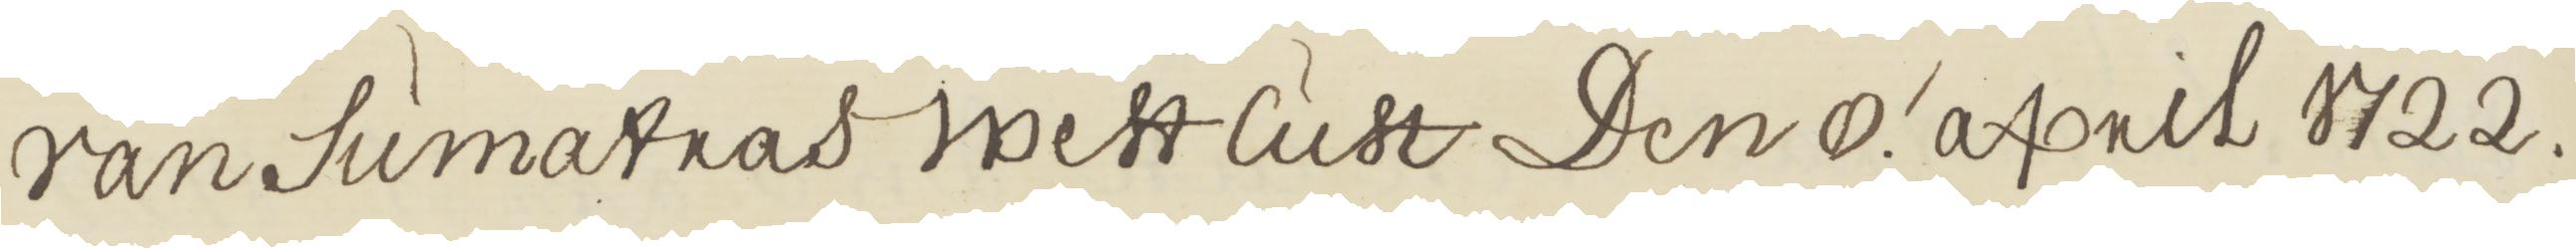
Van Sumatras West Cust Den 8.' april 1722.
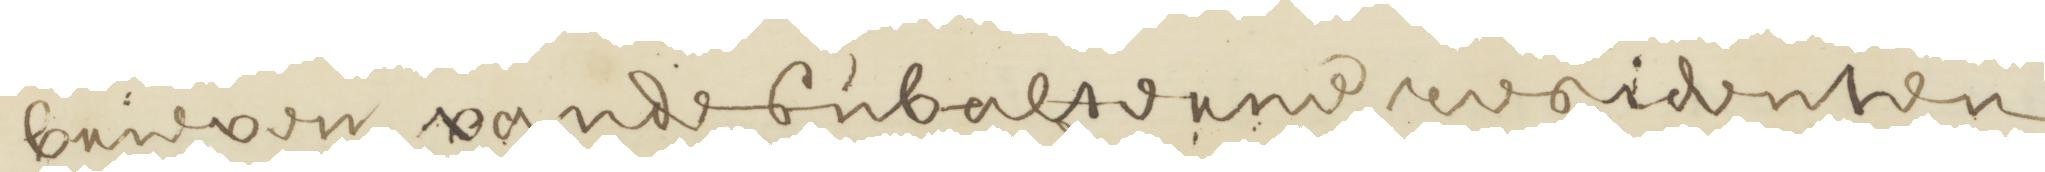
brieven van de subalterne residenten
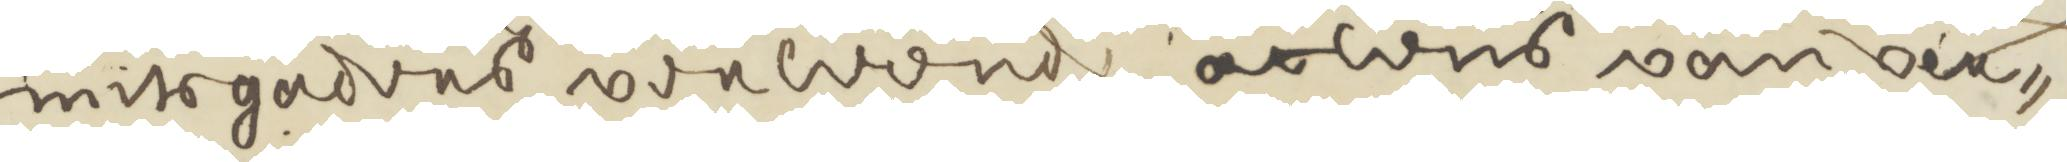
mitsgaders verleend actens van ver„
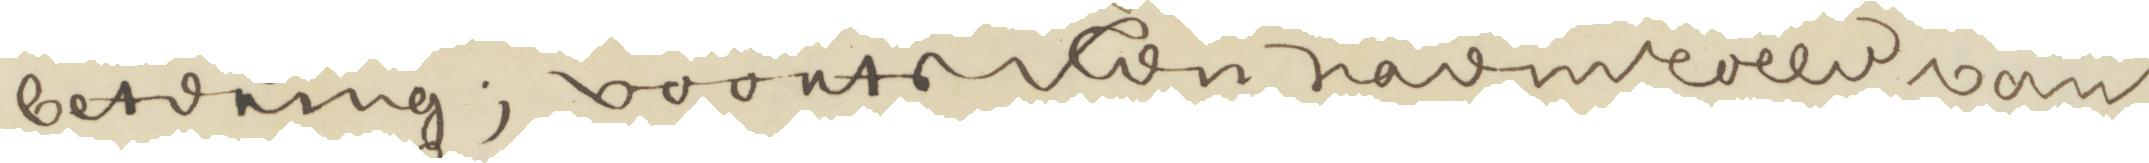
betering; voorts Een naemrolle van
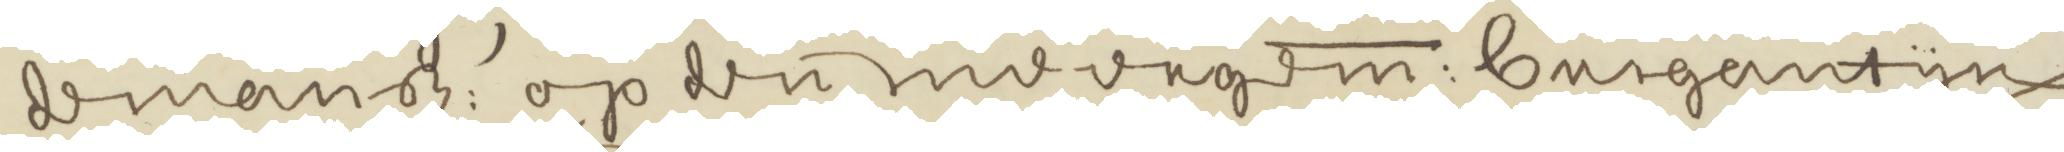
de mansz: op den meergem: brigantijn
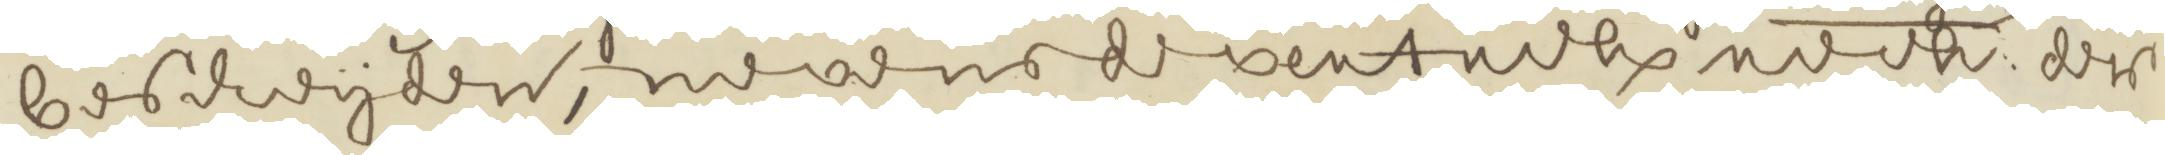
bescheijden, nevens de vertrek reek: der
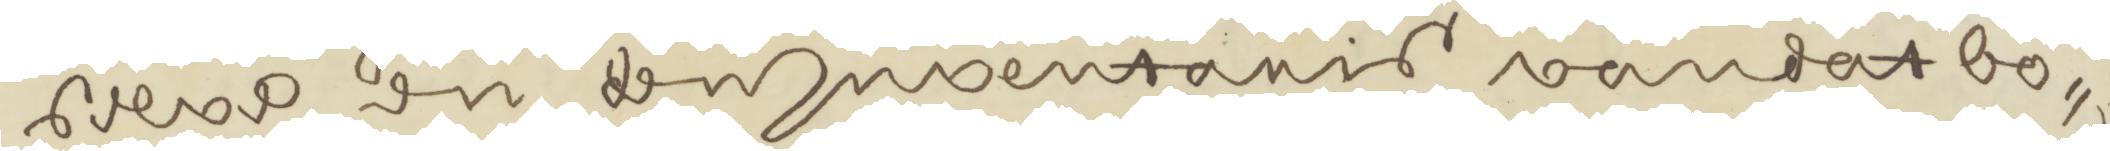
selve en den Inventaris van dat bo„
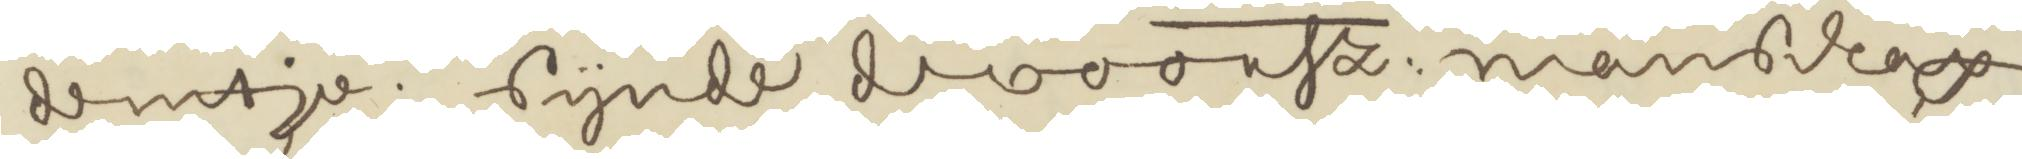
demtje; sijnde de voorsz: manschap
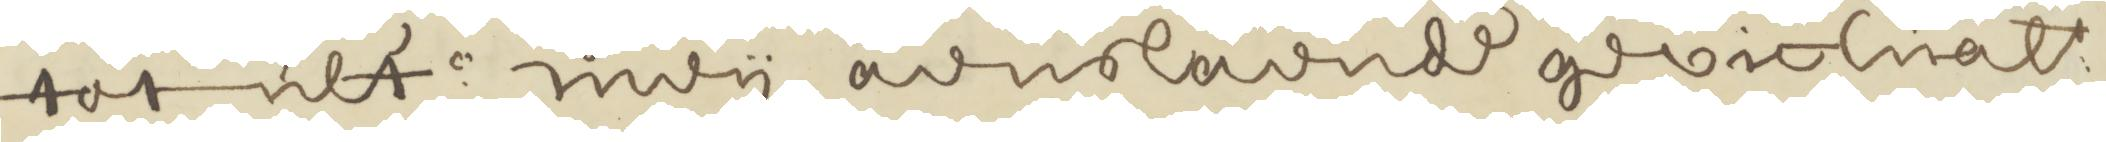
tot ult:o meij aenslaende gevictual:t
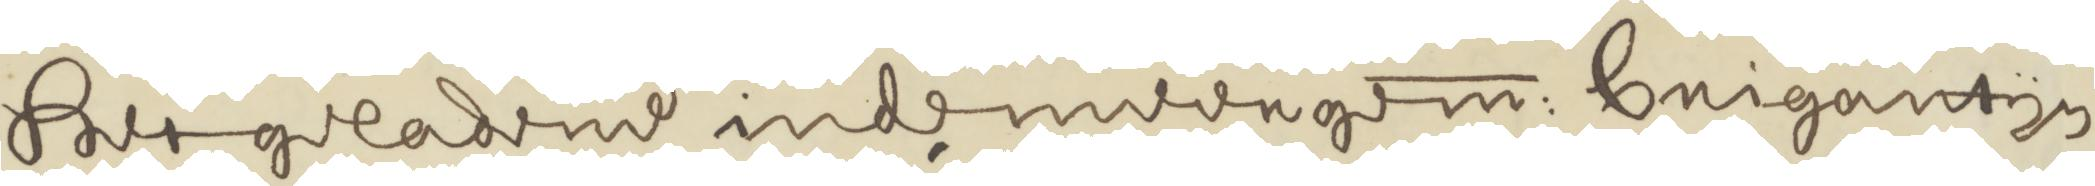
het geladene inde meer gem: brigantijn
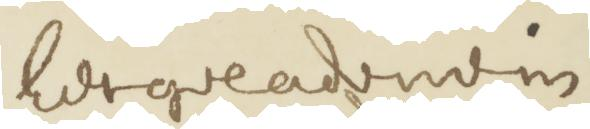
het geladene in
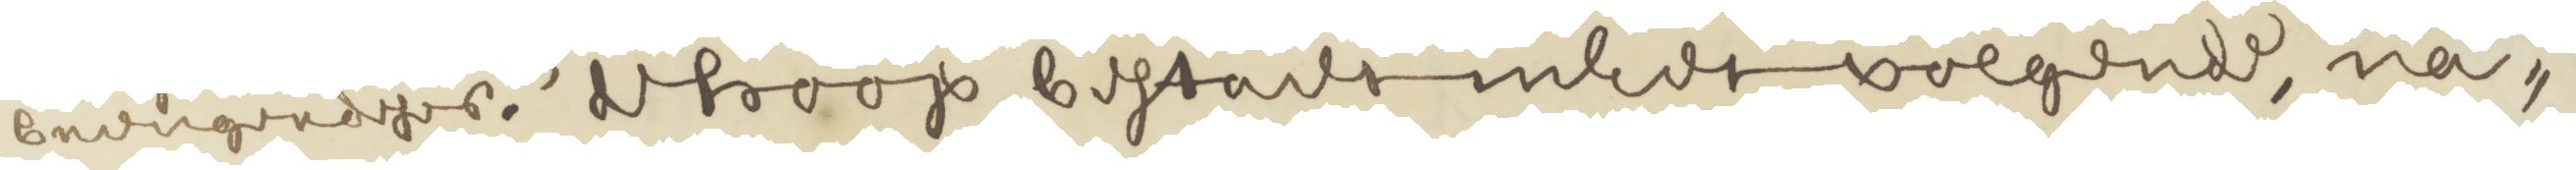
brenger deses. de hoop bestaet in het volgende, na„
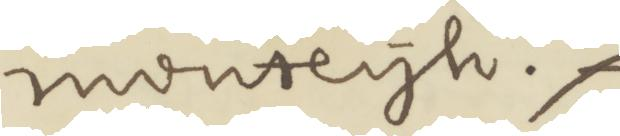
mentlijk.
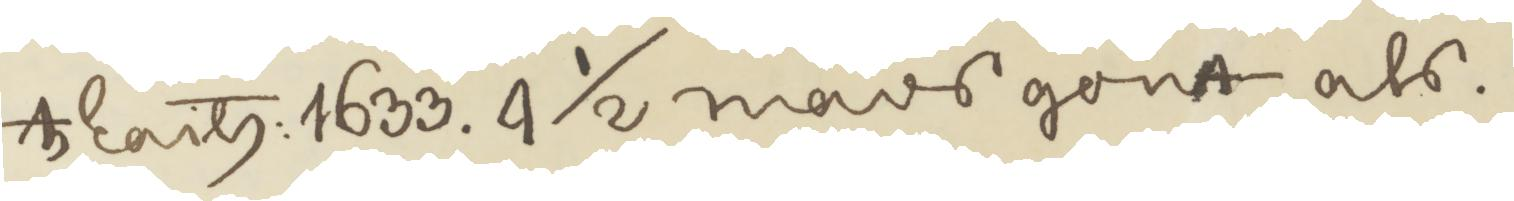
thail: 1633. 4½ maes gout als.
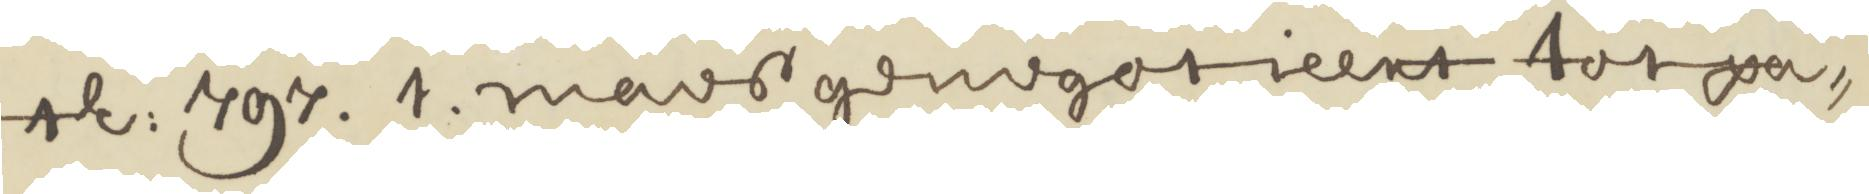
th: 797. 1. maes genegotieert tot pa„
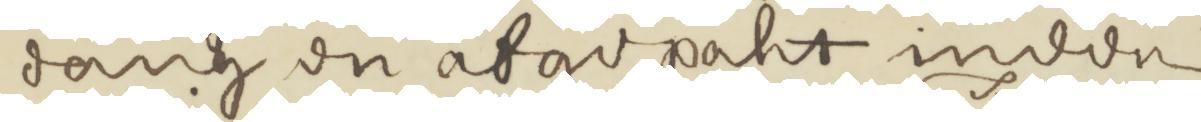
dang en afgepakt meen
